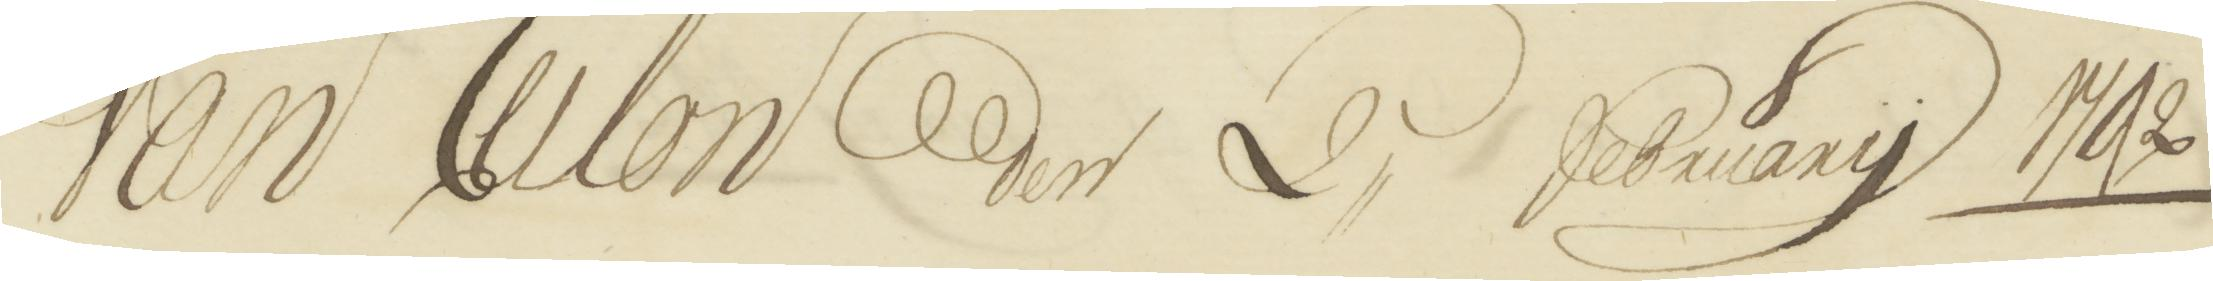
Van Ceilon den 2„' februarij 1742
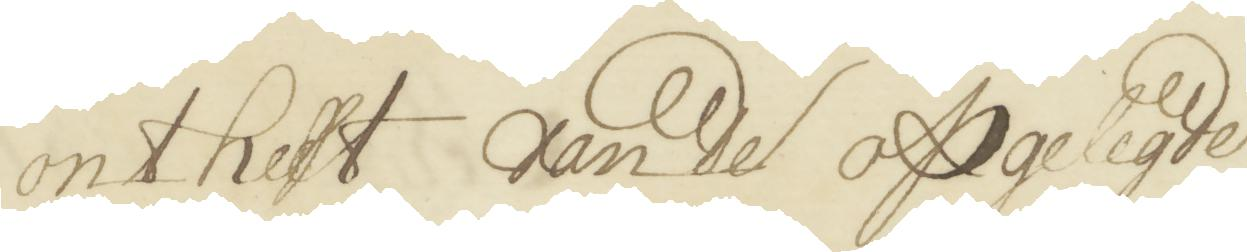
ontheft van de opgelegde
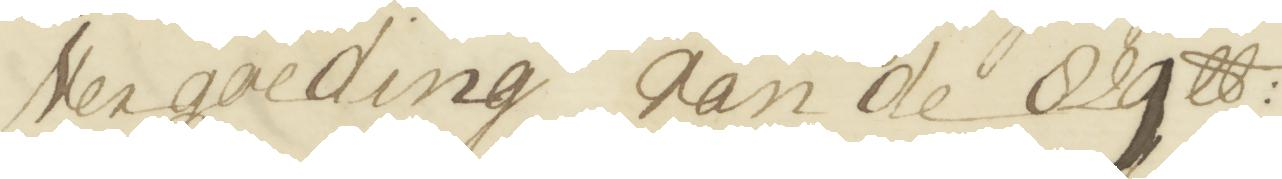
vergoeding van de 829 lb:
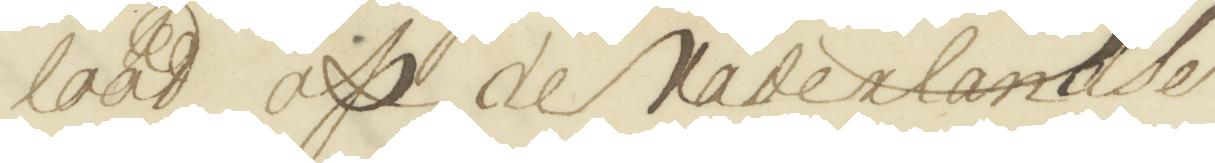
lood op de vaderlandse
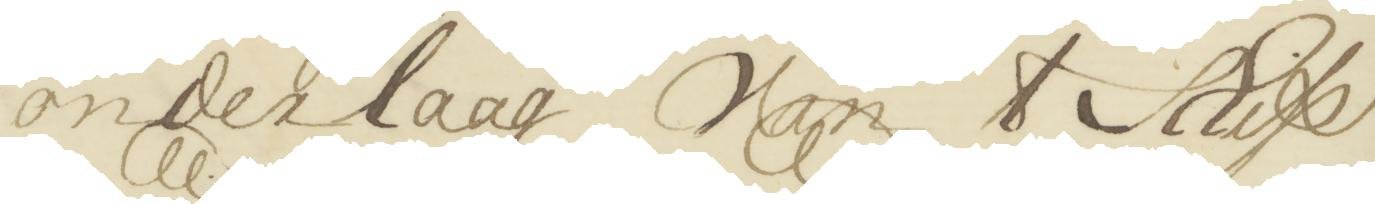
onderlaag van ’t Schip
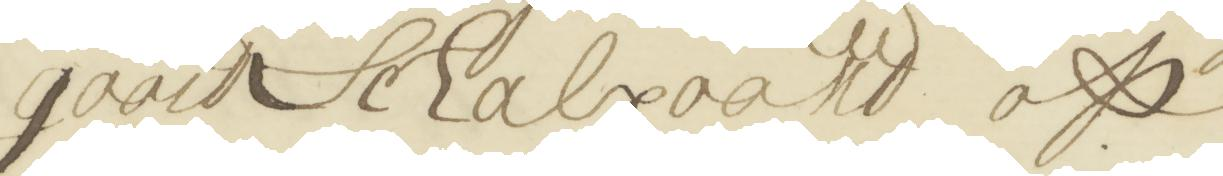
gooid Schalcoord op
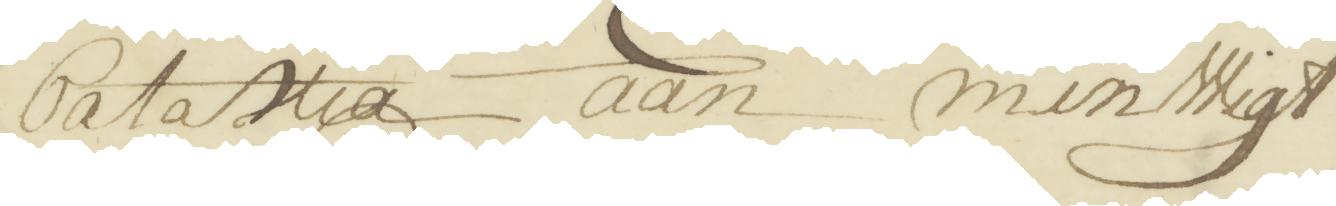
batavia aan minwigt
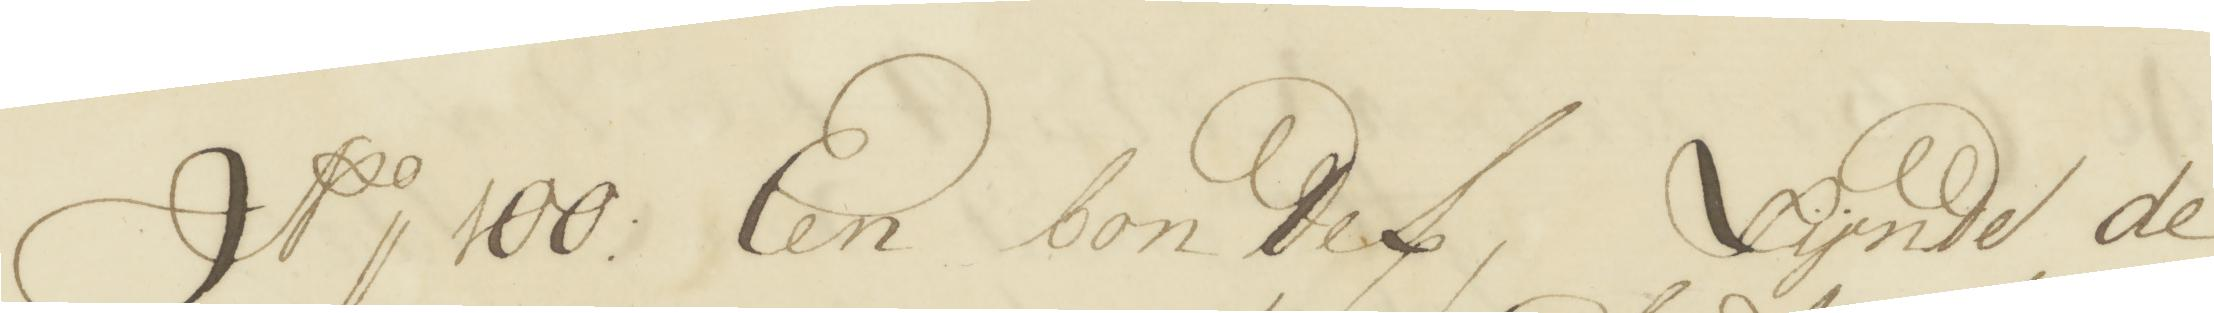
N„o 100: Een bon def, zijnde de
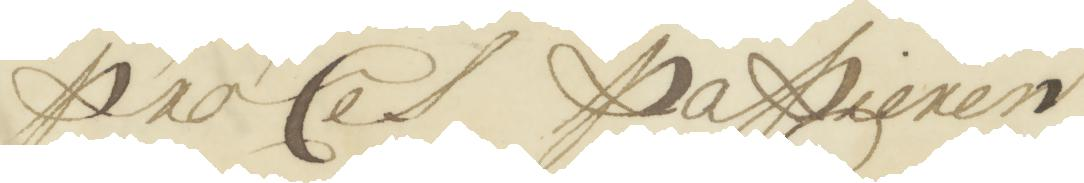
proces papieren
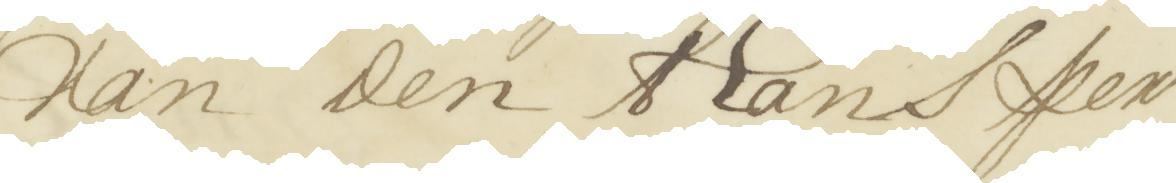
van den thans per
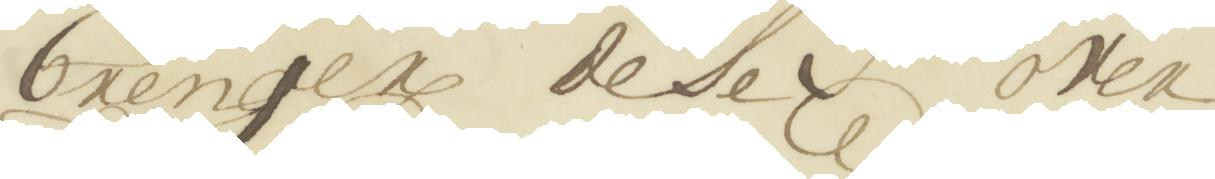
brenger deses over
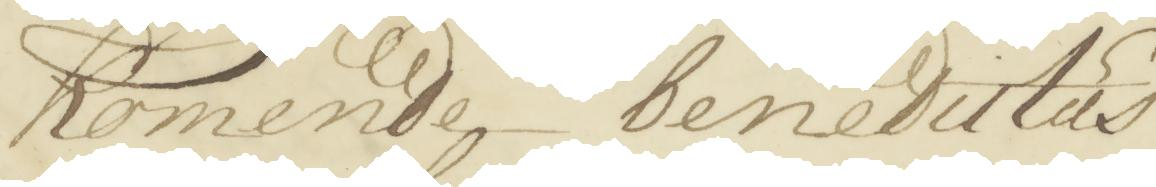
komende benedictus
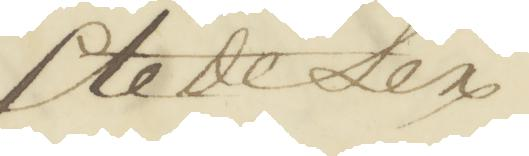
stedeler
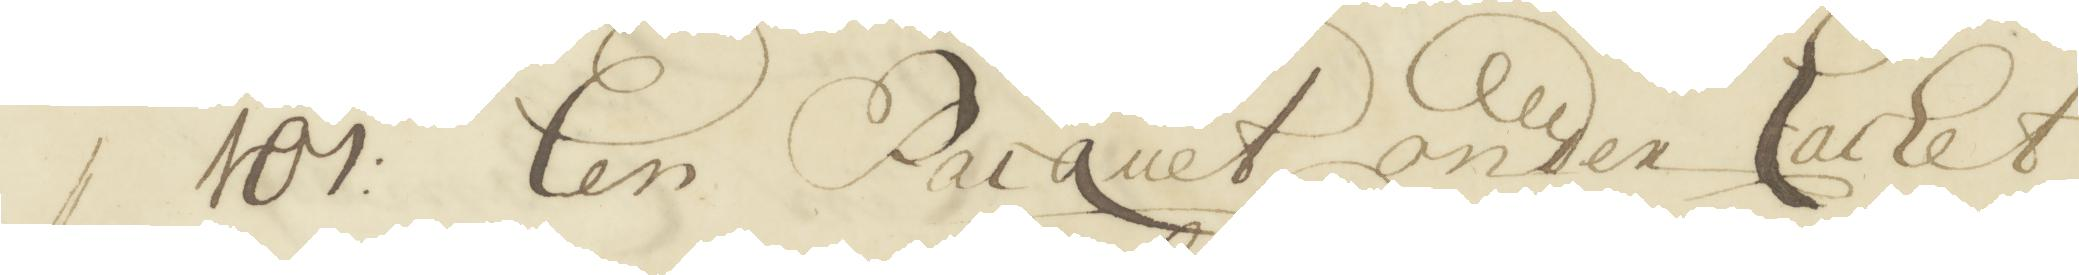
„ 101: Een Pacquet onder Cachet
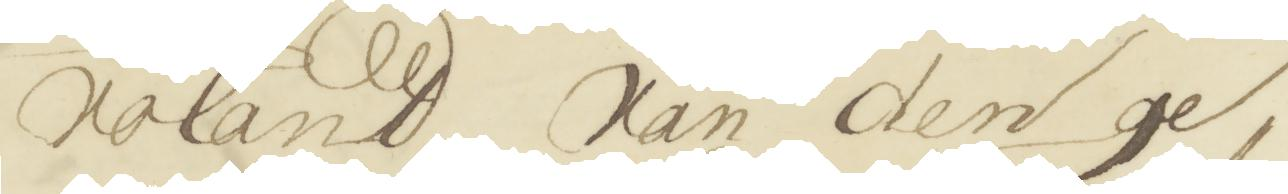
roland van den ge„
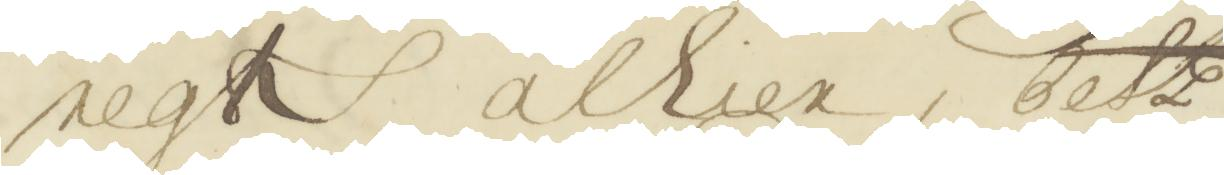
regts alhier, besz:
